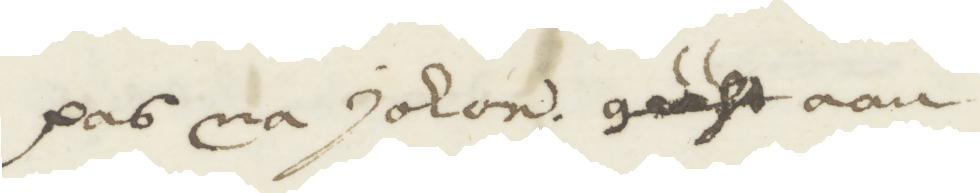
pas na johor. geeft aan
